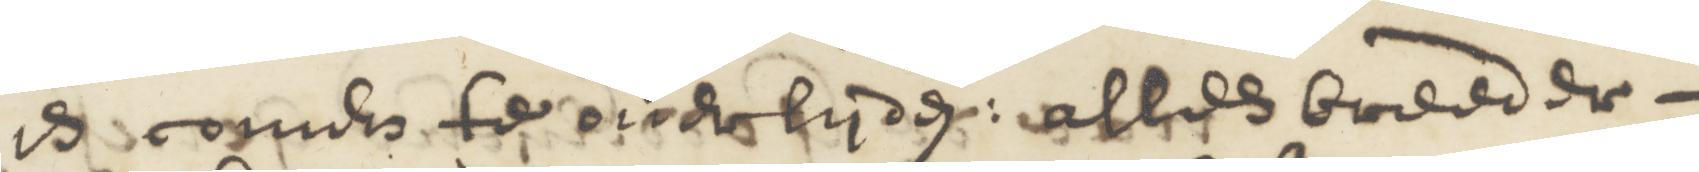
is comen te ouerlijden: alles breeder-
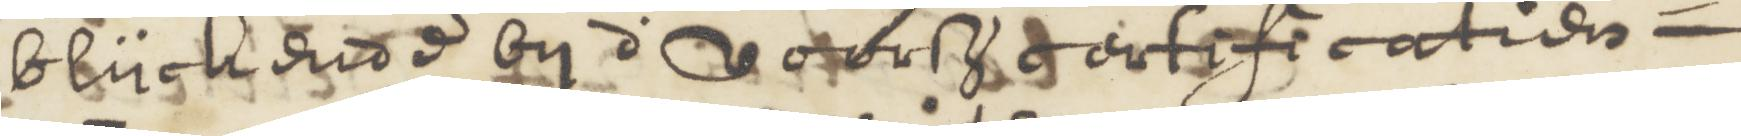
blijckende by d’voors certificatien=
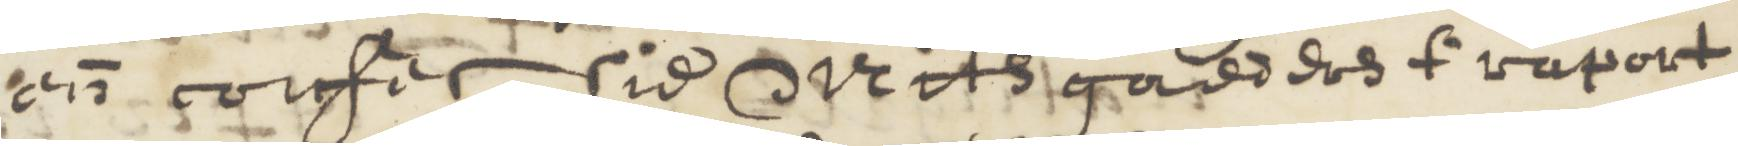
en confessie mitsgaeders t' raport
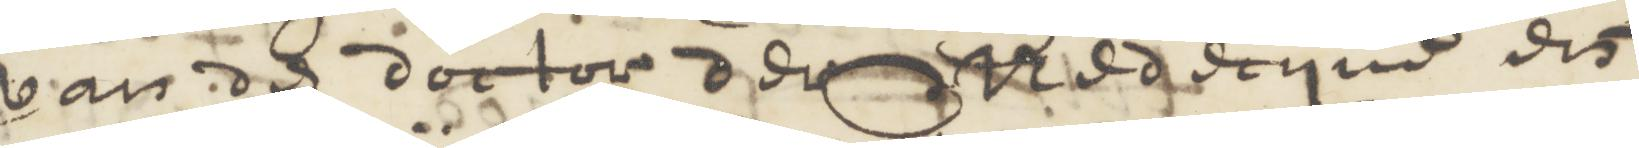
van de doctor der medecyne en-
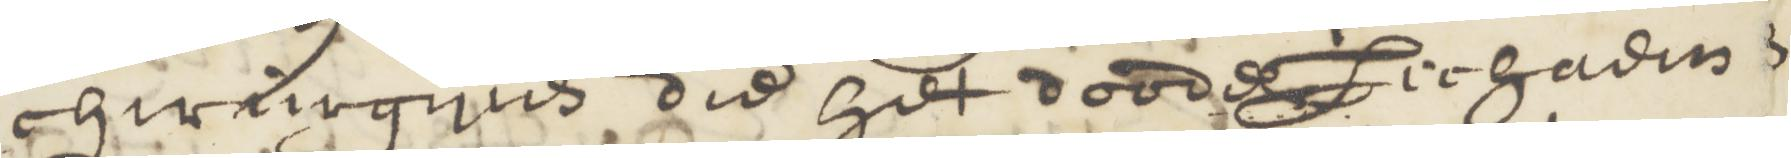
chirurgijns die het doode lichaem
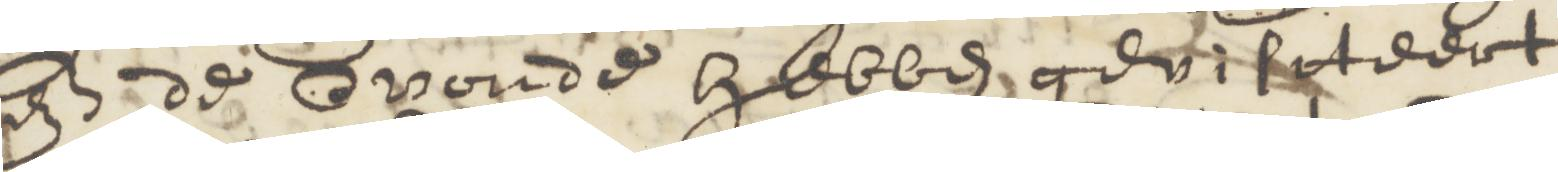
ende de wonde hebben gevisiteert
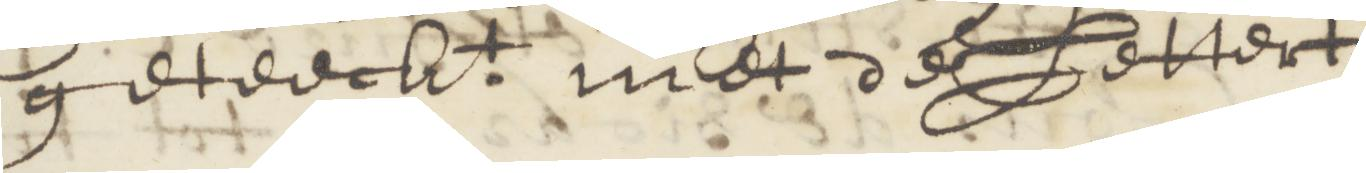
geteeck.t met delettert D.
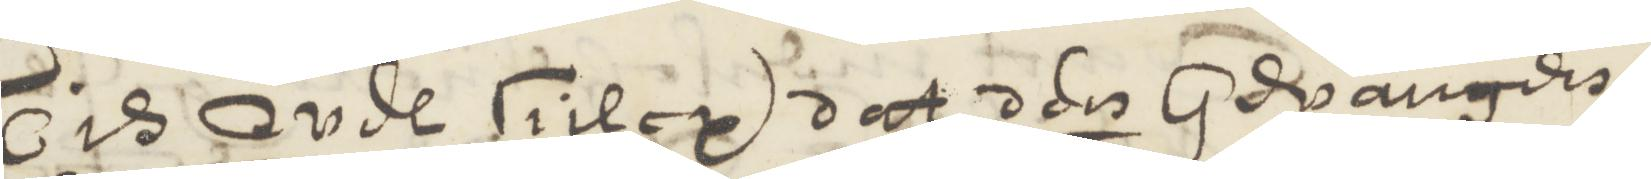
is wel sulcx dat den Gevangen
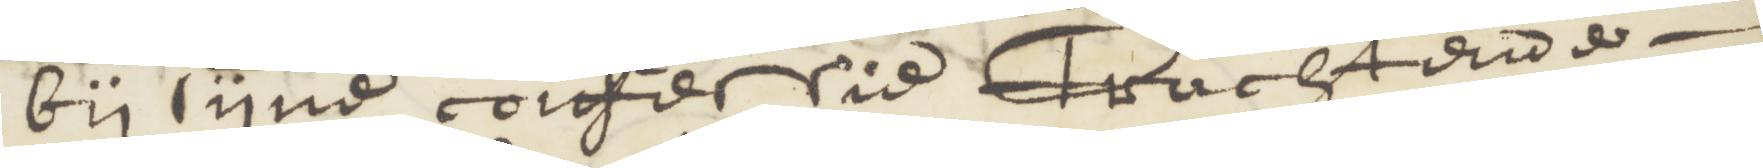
bij sijne confessie fruchtende —
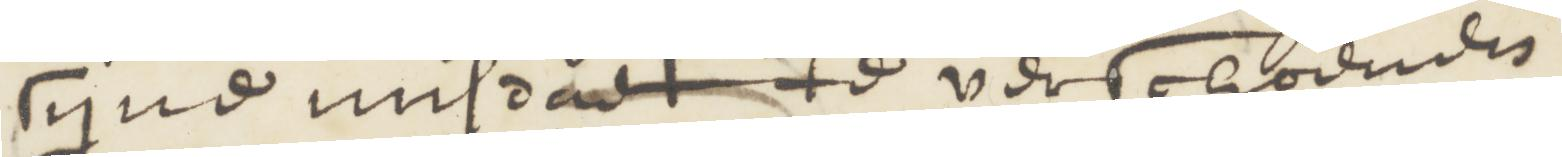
syne misdaet te verschoenen
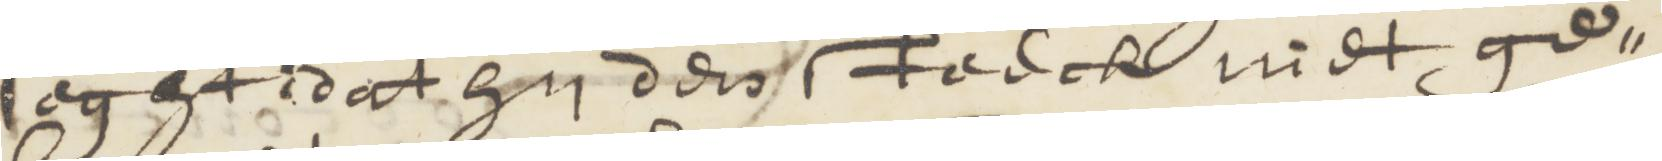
seght dat hy den steeck niet ge„
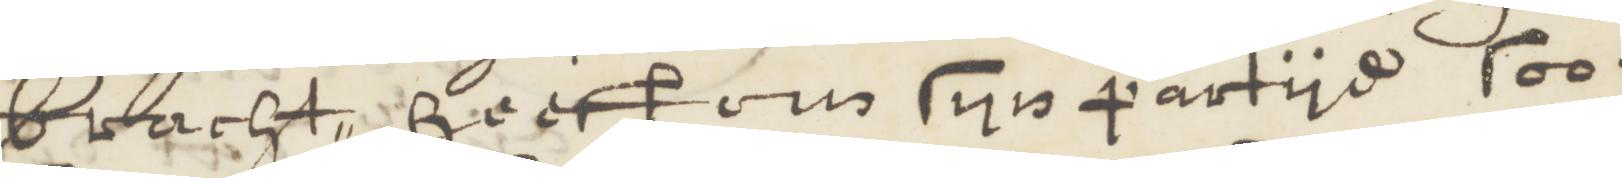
bracht„ heeft om syn partije soo
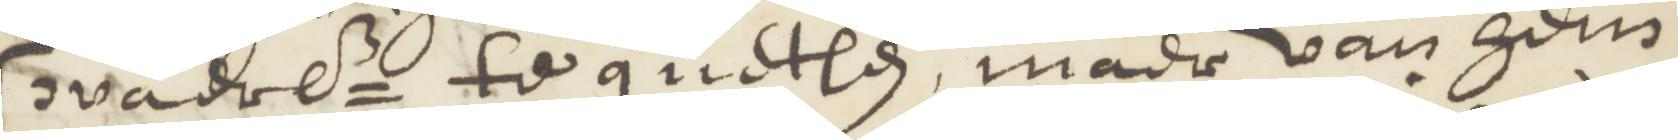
swaerlijk te quetsen, maer van hem
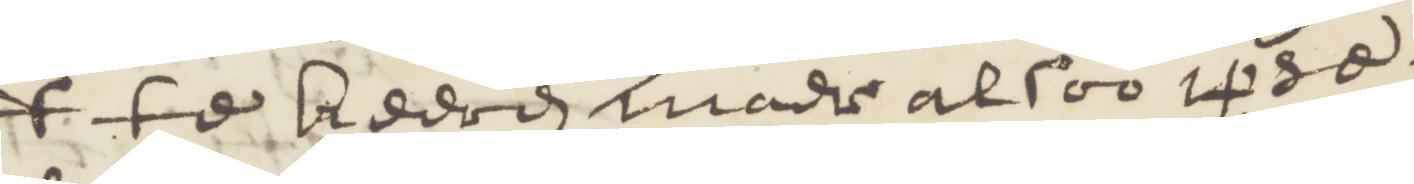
aff te keeren maer alsoo ipse
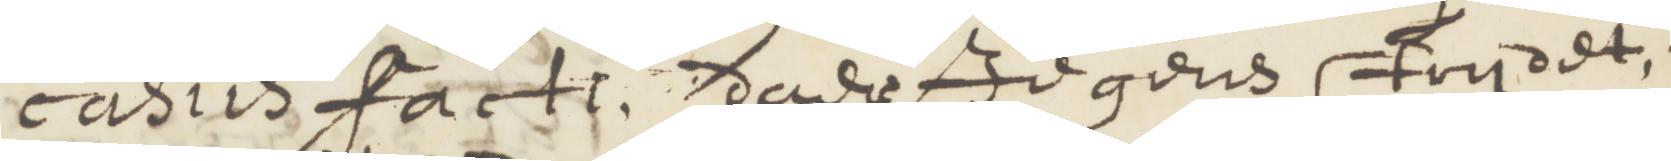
casus facti daer Jegens strydet,
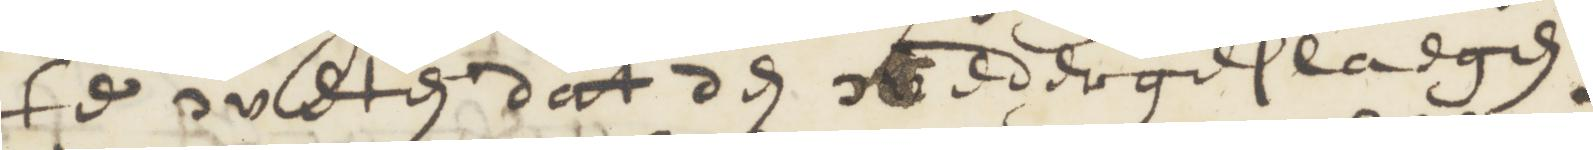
te weten dat den wedergeslaegen
